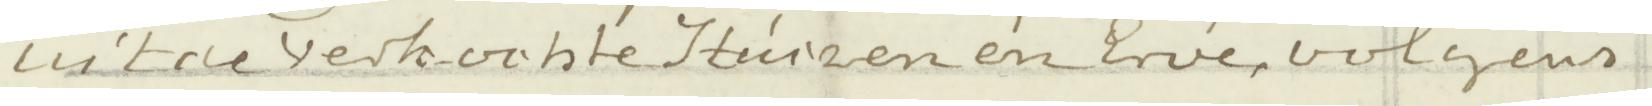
uit de verkochte Huizen en Erve volgens
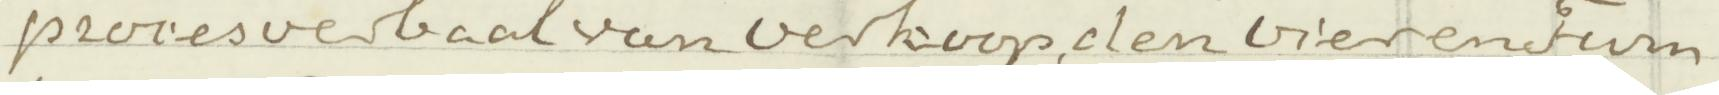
procesverbaal van verkoop, den vier en Twin
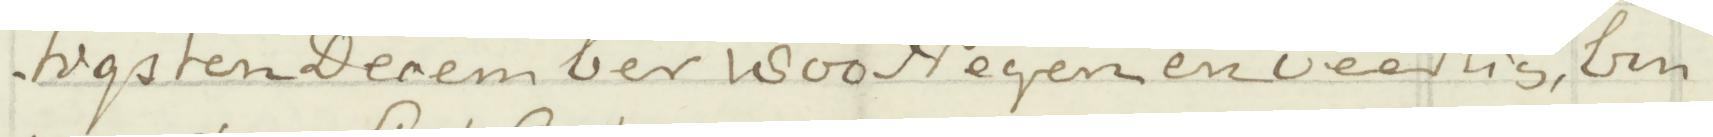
=tigsten December 1800 Negen en veertig, bin
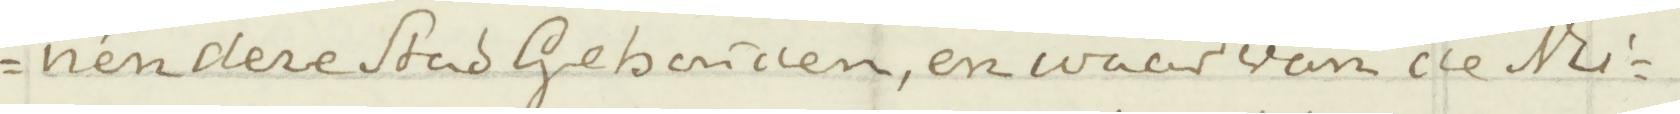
=nen deze stad Gehouden, en waar van de Mi=
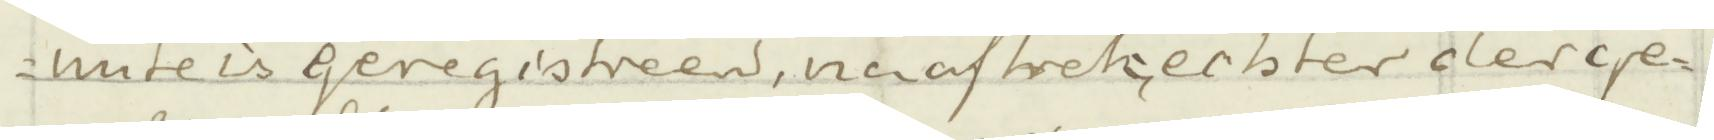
=nute is Geregistreerd, na aftrek echter der ge=
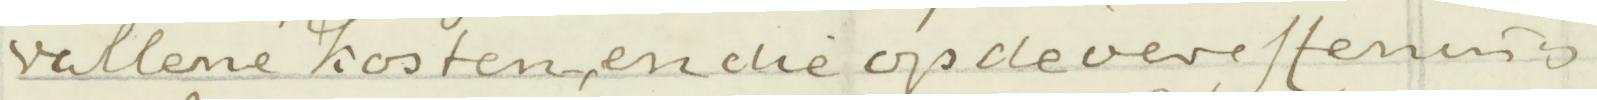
vallene kosten, en die op de vereffening
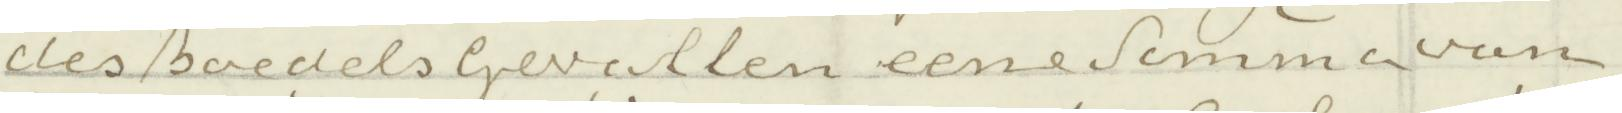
des Boedels Gevallen eene somma van
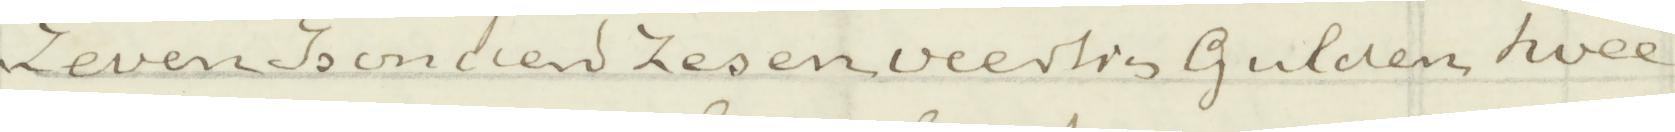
Zeven honderd zes en veertig Gulden twee
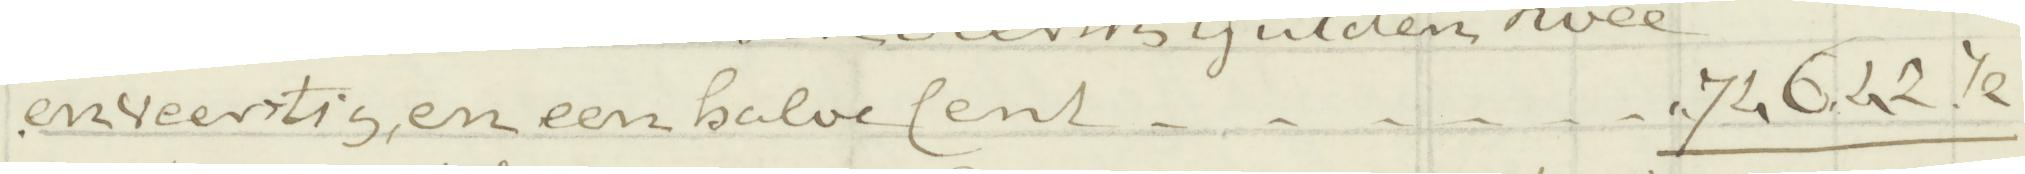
en veertig, en een halve Cent - - - - - - „746„42.½
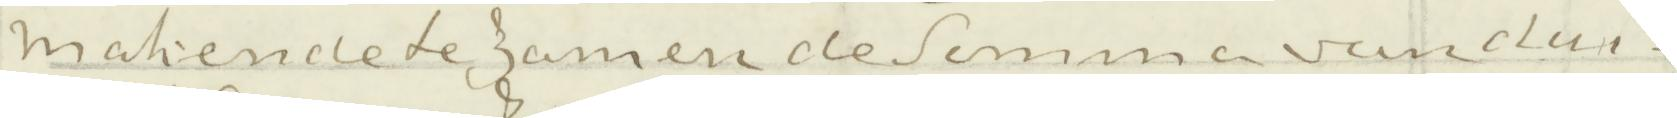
makende te zamen de somma van dui-
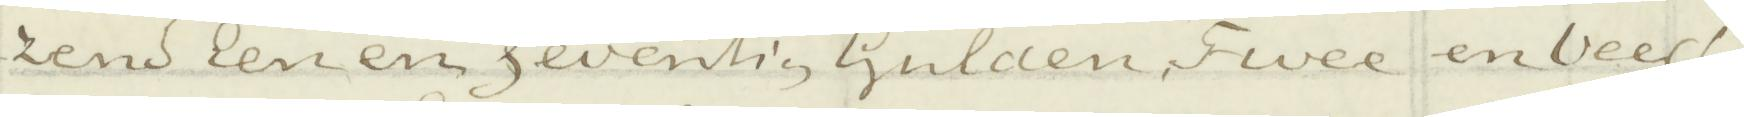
zend Een en zeventig Gulden, Twee en veer
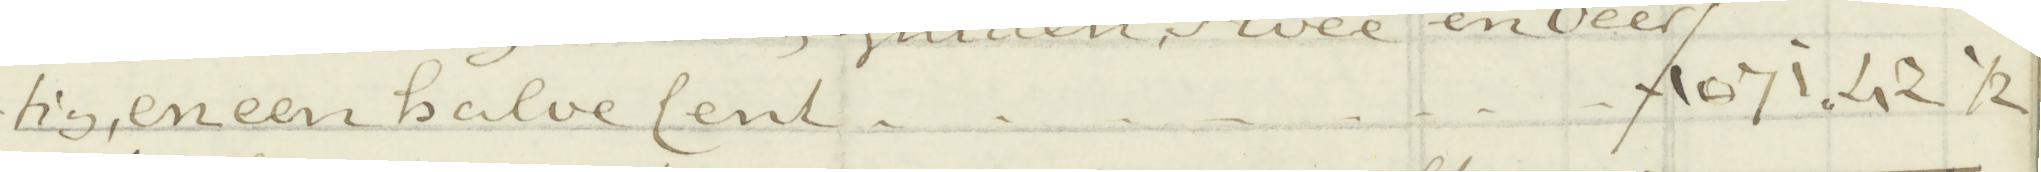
tig, en een halve Cent - - - - - - - - ƒ1071„42½
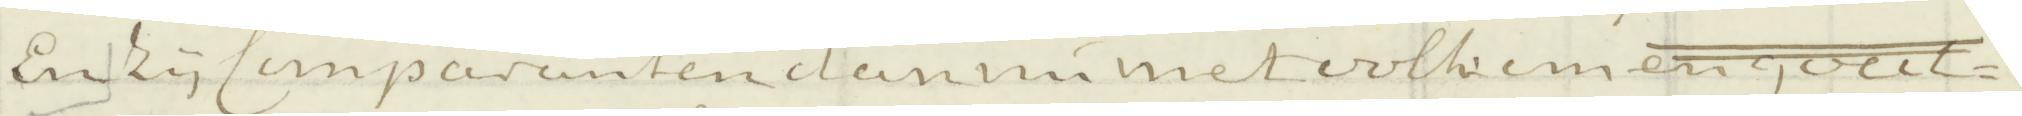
En zij Comparanten dan nu met volkomen goed=
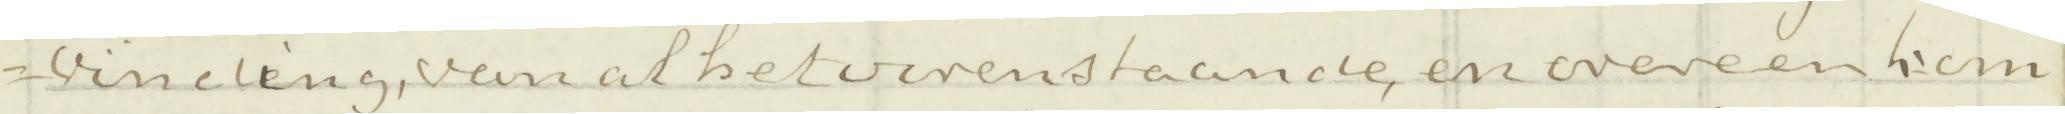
=vinding van al het vorenstaande en overeenkom
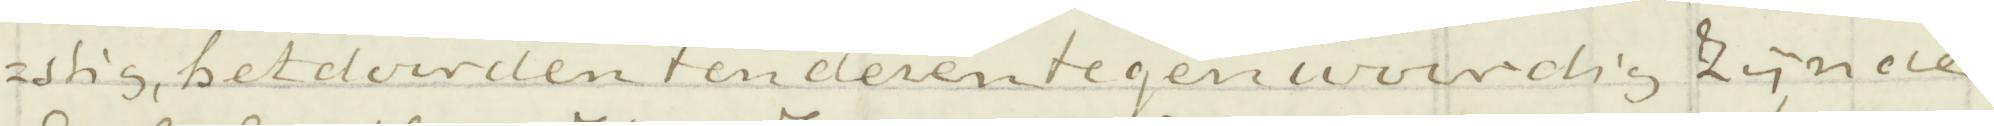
=stig, het door den ten dezen tegenwoordig zijnde
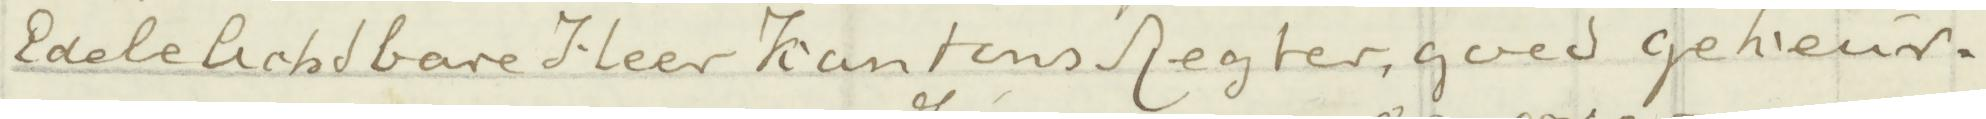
Edele Achtbare Heer Kantons Regter, goed gekeur=
